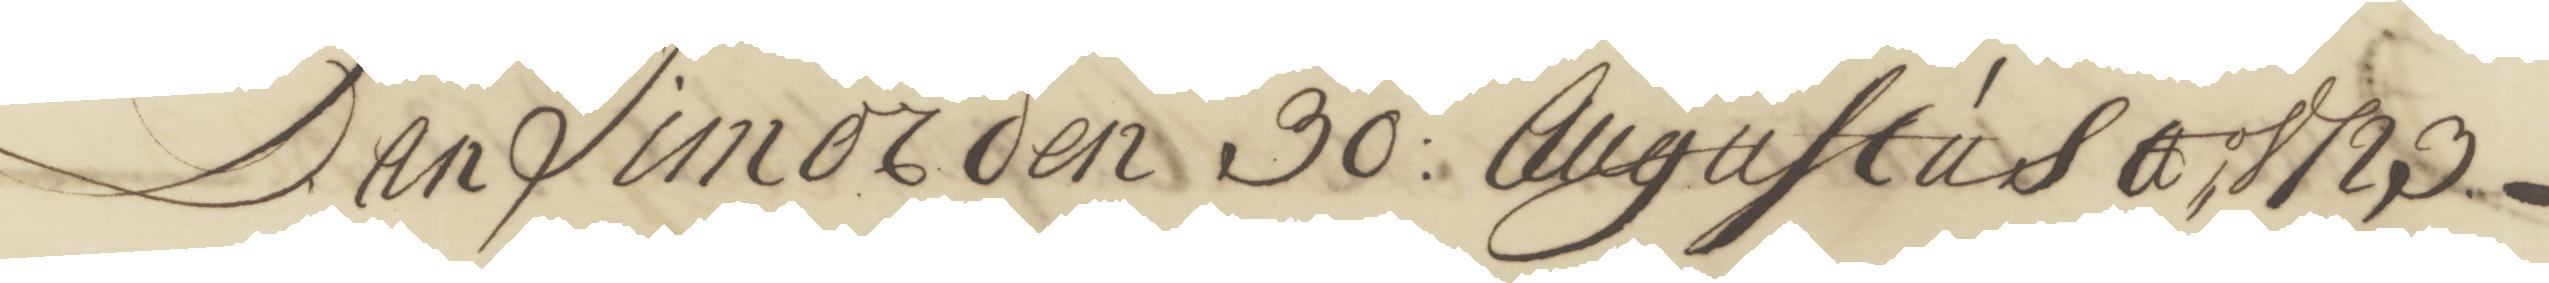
Van Timor den 30:' Augustus a„o 1723.
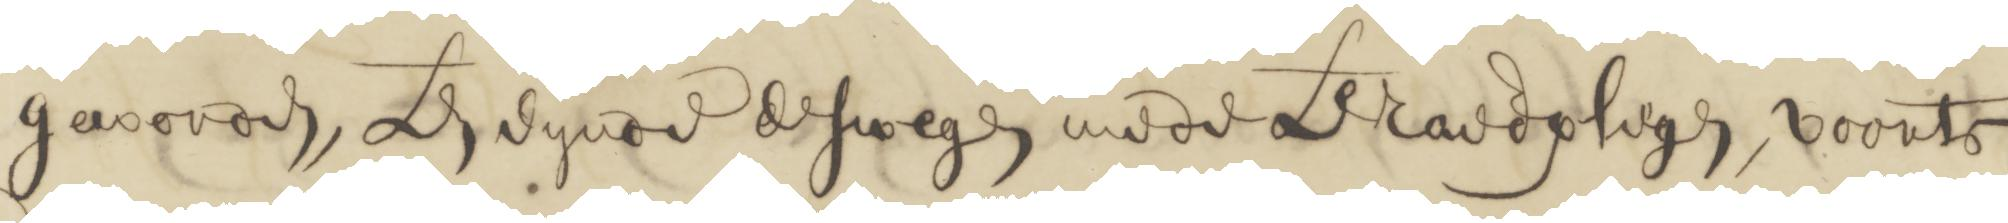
geworden, ten eijnde deswegen mede te raedplegen, voorts
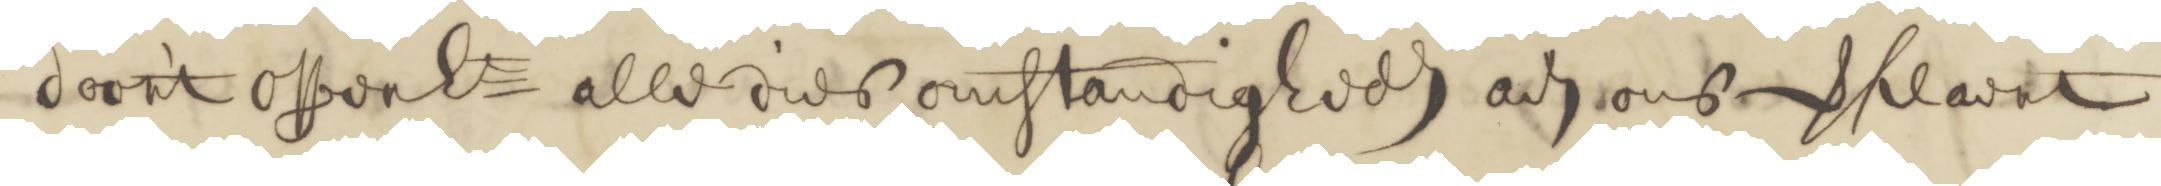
door't opperh=t alle dies omstandigheden aen ons verklaert
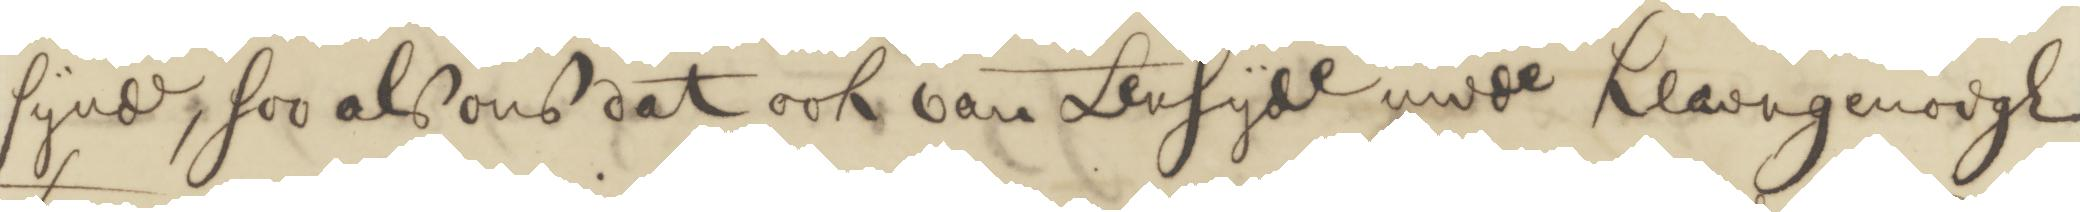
sijnde, soo als ons dat ook van tersijde mede klaergenoegh
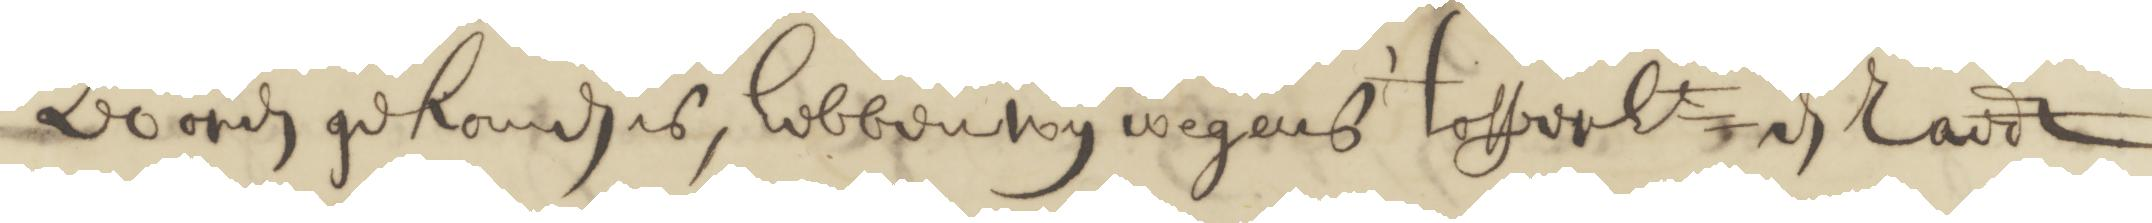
te voren gekomen is, hebben wij wegens 't opperh=t en raedt
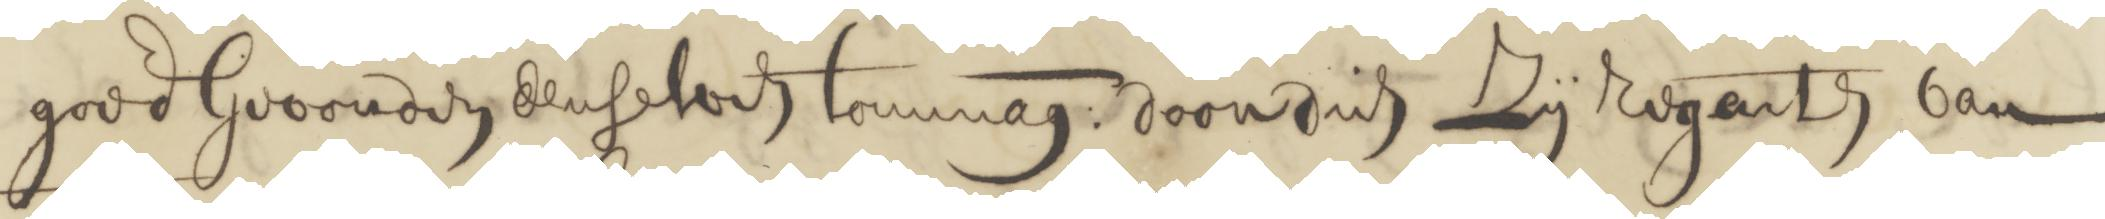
goed Gevonden denselven tommag: door dien zij regenten van
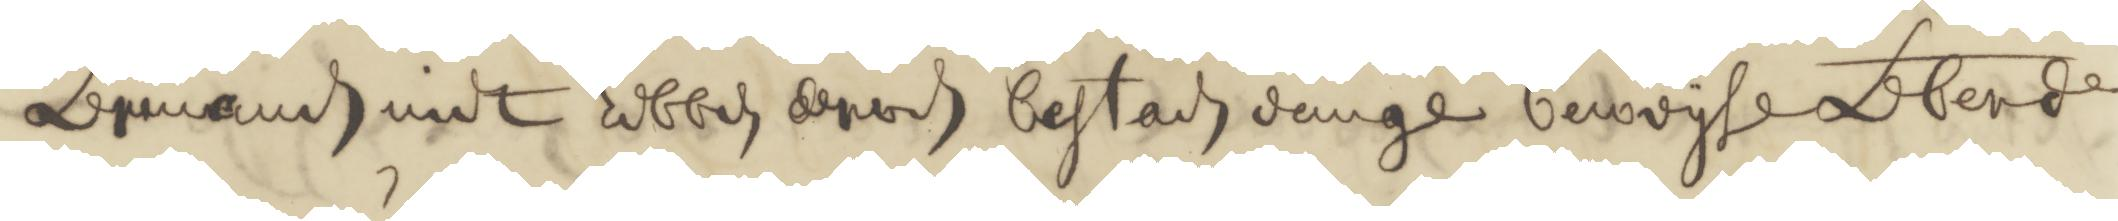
termanen niet hebben derven bestaen eenige beweijse te berde
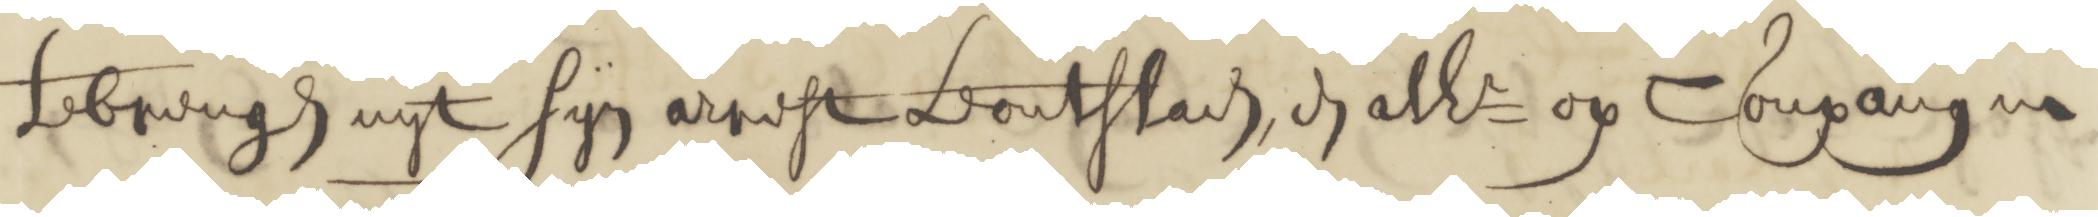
te brengen uijt sijn arrest te ontslaen, en alh=r op Coupang in
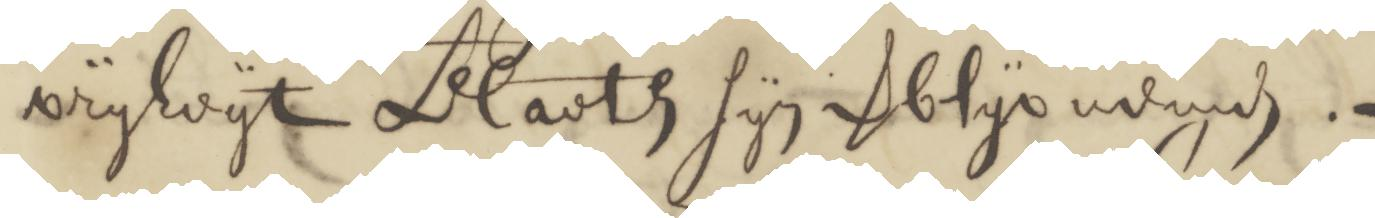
vijheijt te laeten sijn verblijv nemen.
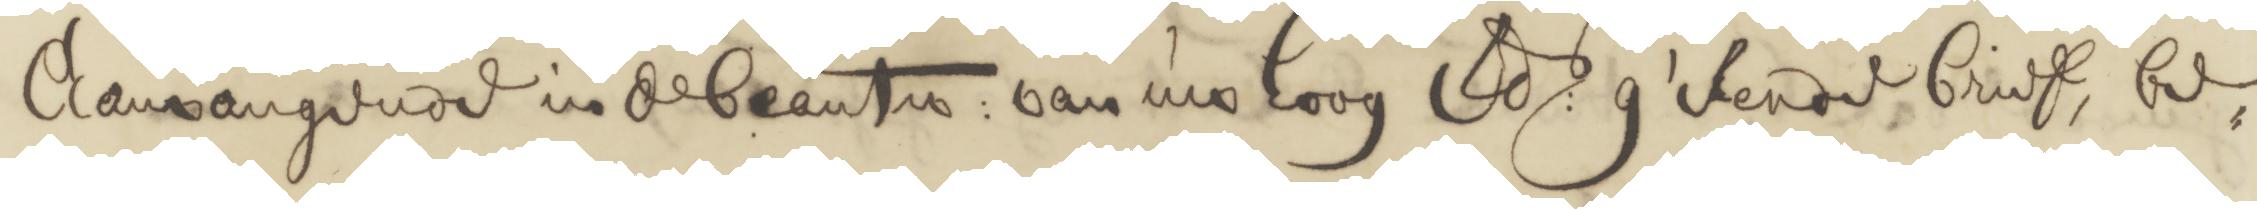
Aanvangende in de beantw: van uw hoog Ed:s g'Eerde brief, be„
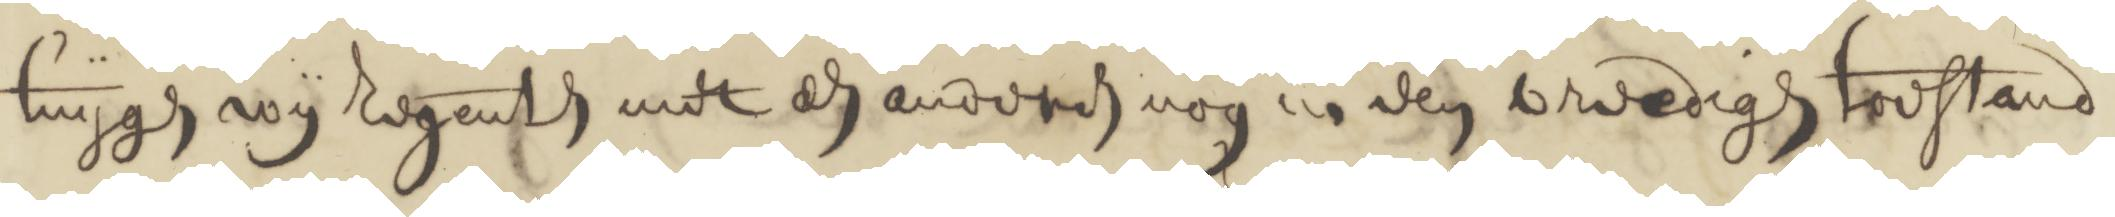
tuijgen wij regenten met den anderen nog in een vreedigen toestand
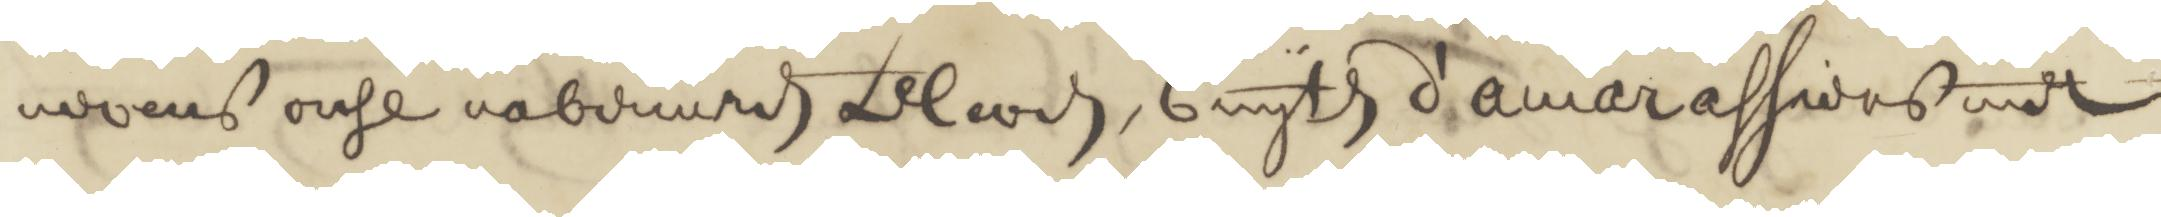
nevens onse nabeuuren televen, buijten d' amarassiers met
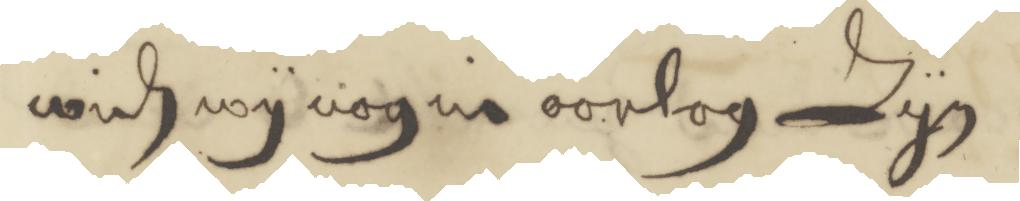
wien wij nog in oorlog zijn
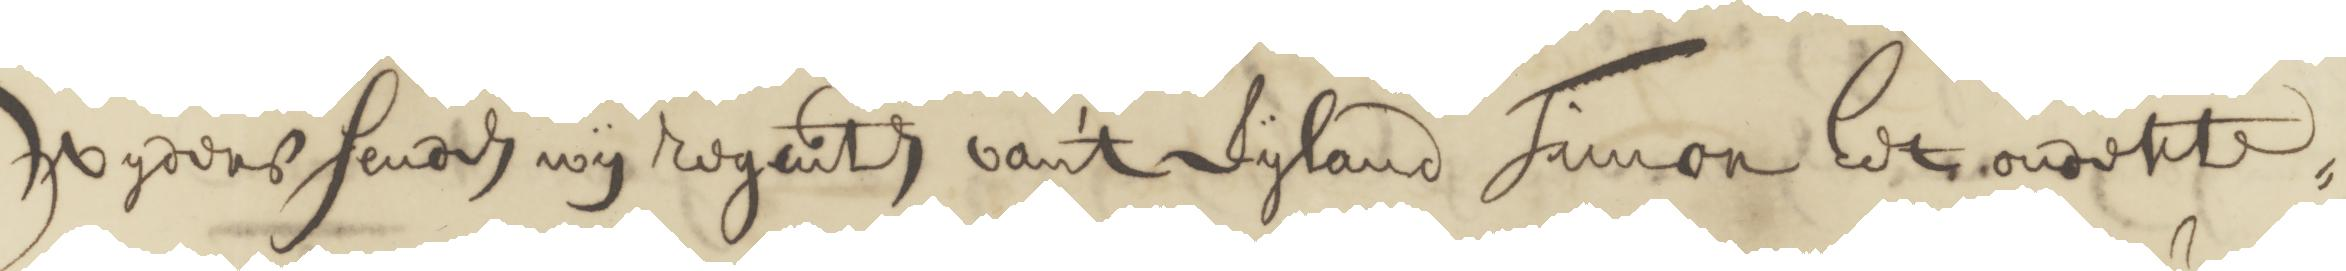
Wijders senden wij regenten van 't Eijland Simon het ondekte„
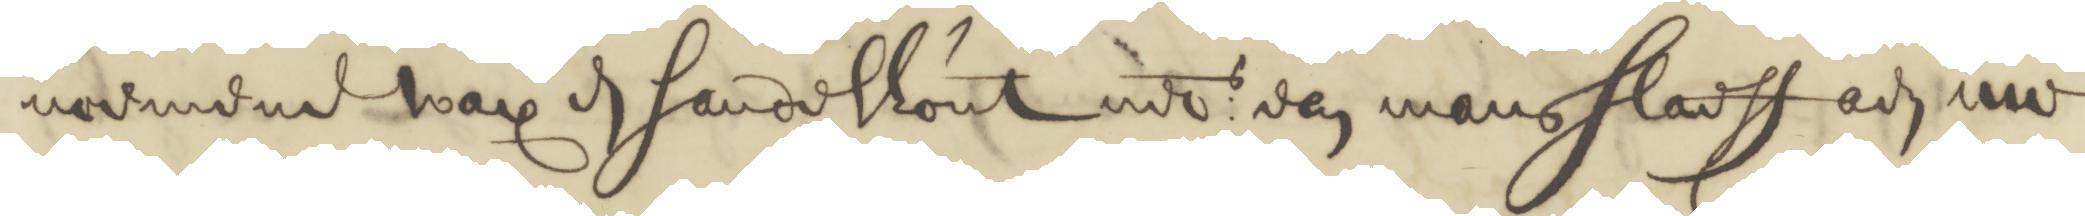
noemene wax en sandelhout nev:s een mansslaeff aen uw
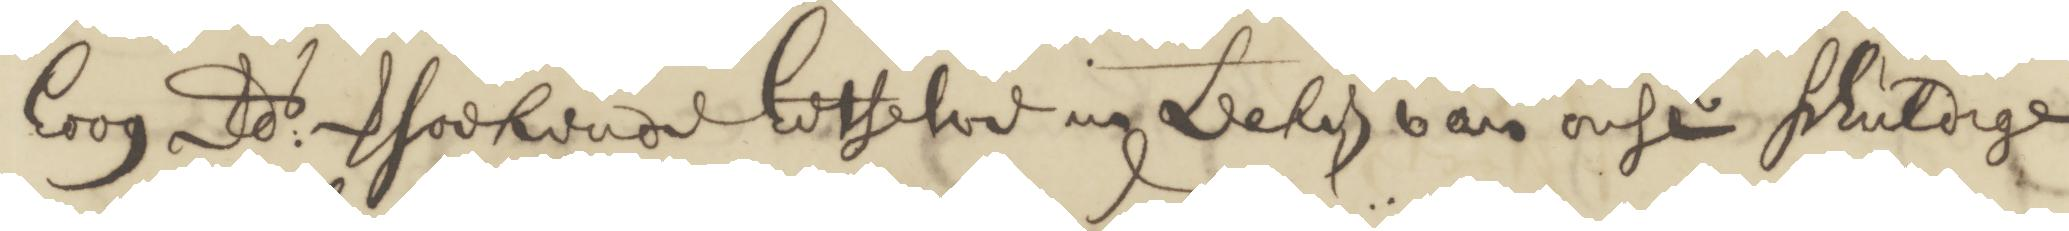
hoog Ed:s versoekende hetselve in teeken van onse schuldige
